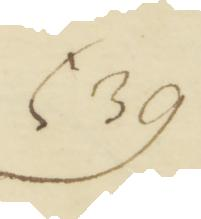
539
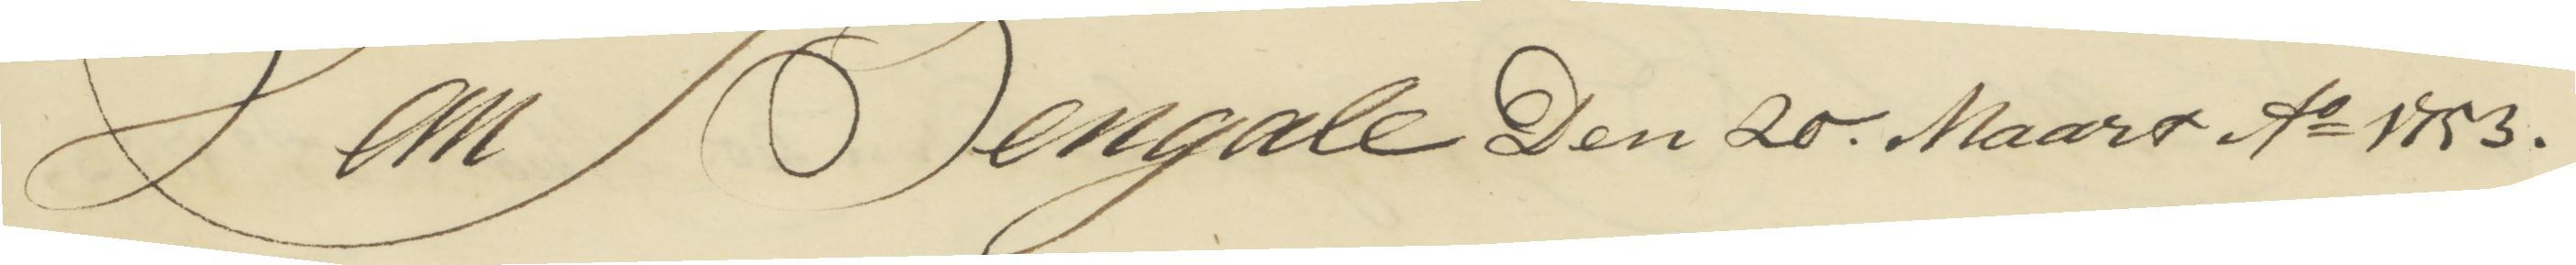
Van Bengale Den 20. Maart A=o 1753.
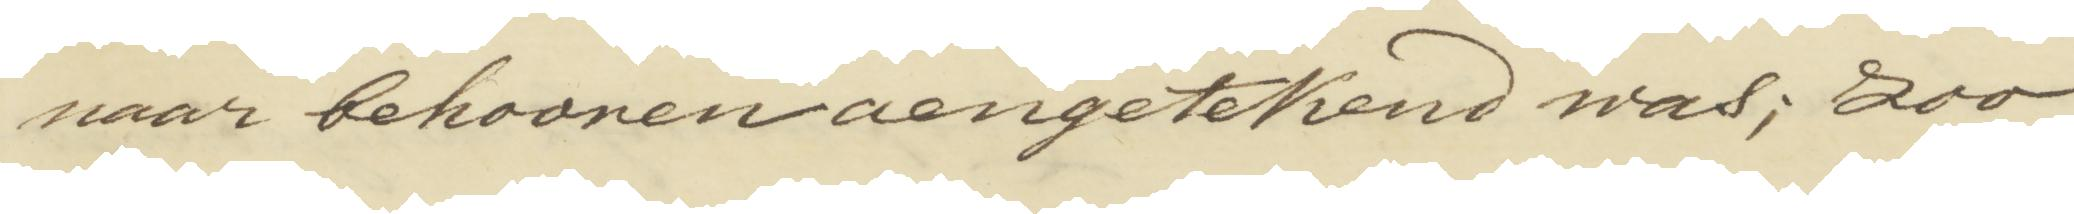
naar behooren aengetekend was; zoo
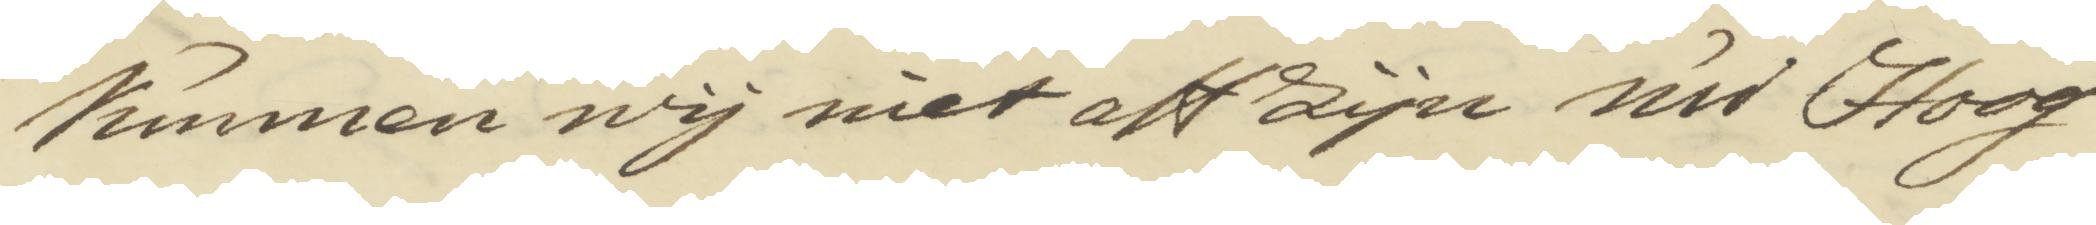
Kunnen wij niet aff zijn uw Hoog
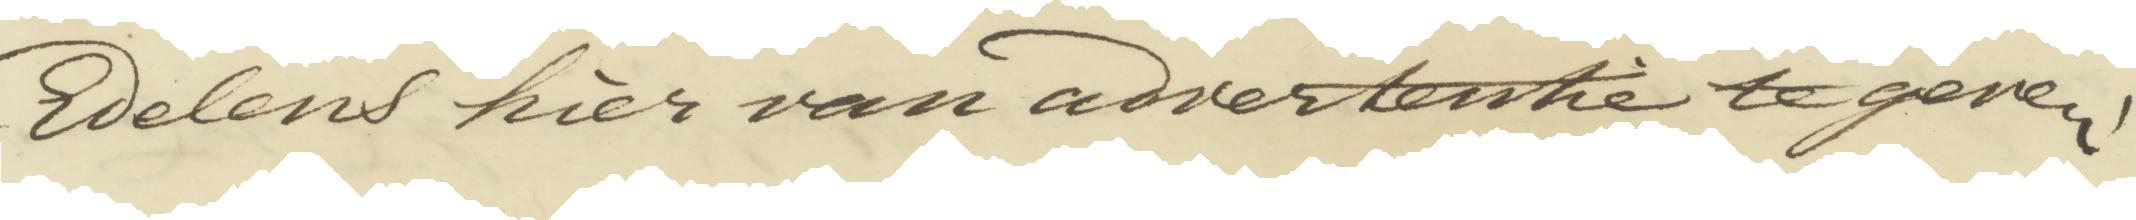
Edelens hier van advertentie te geven,
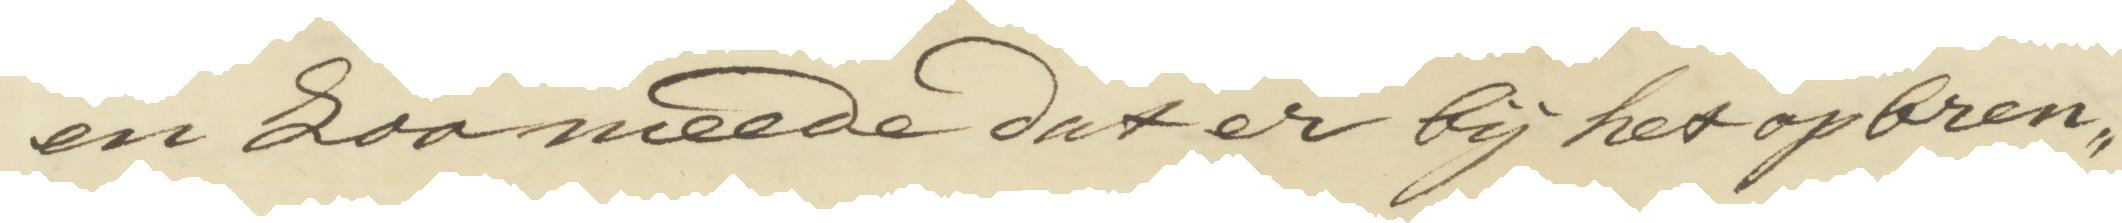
en Zoo meede dat er bij het op bren„
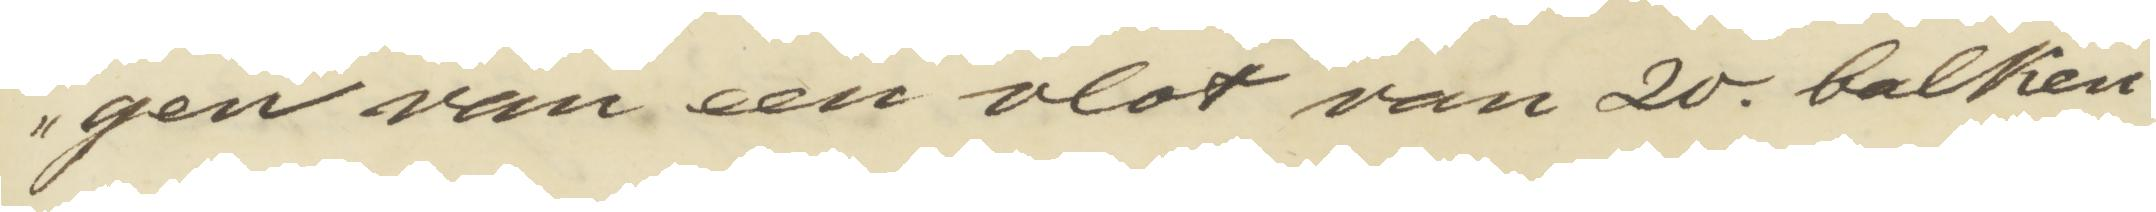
„gen van een vlot van 20. balken
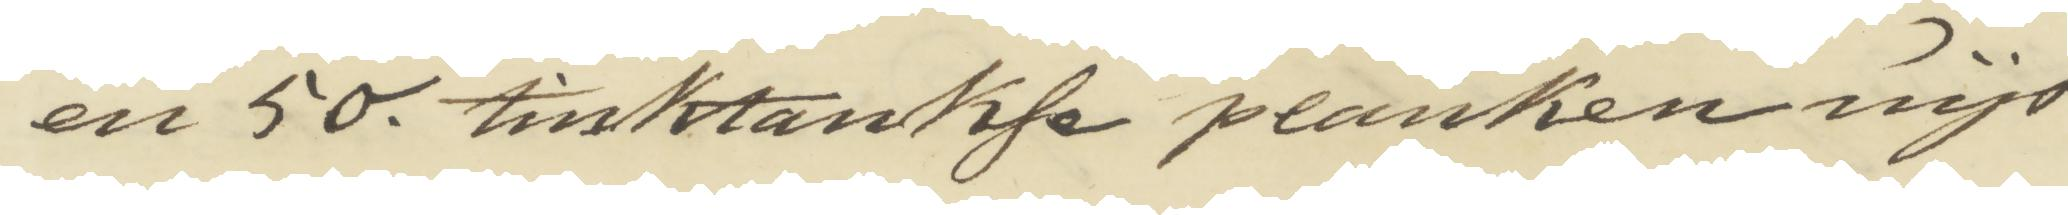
en 50. tinktankse planken uijt
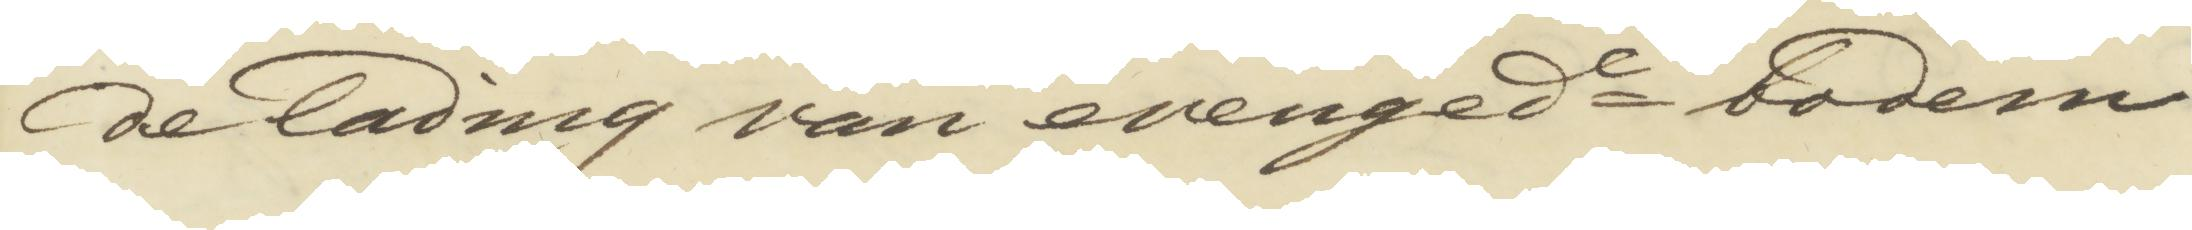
de lading van evenged=e bodem
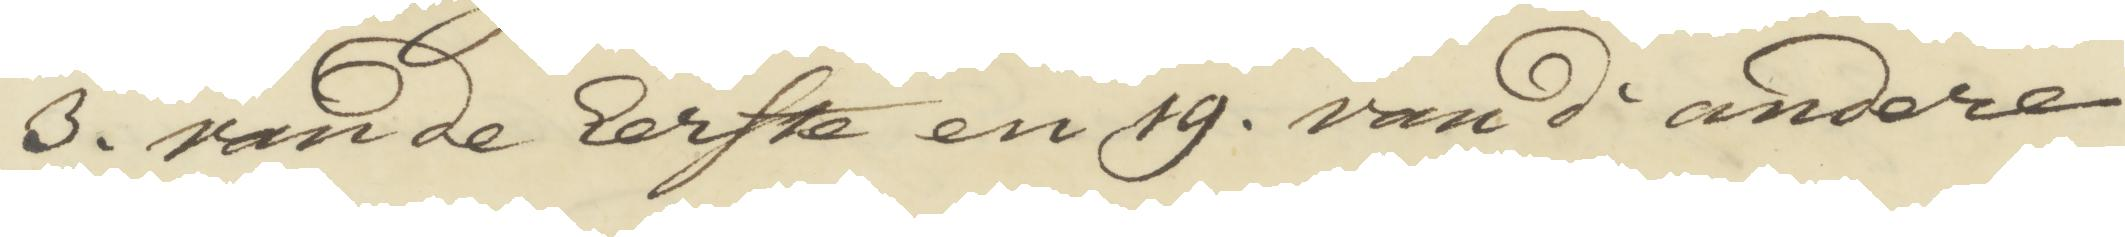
3. van de Eerste en 19. van d’ andere
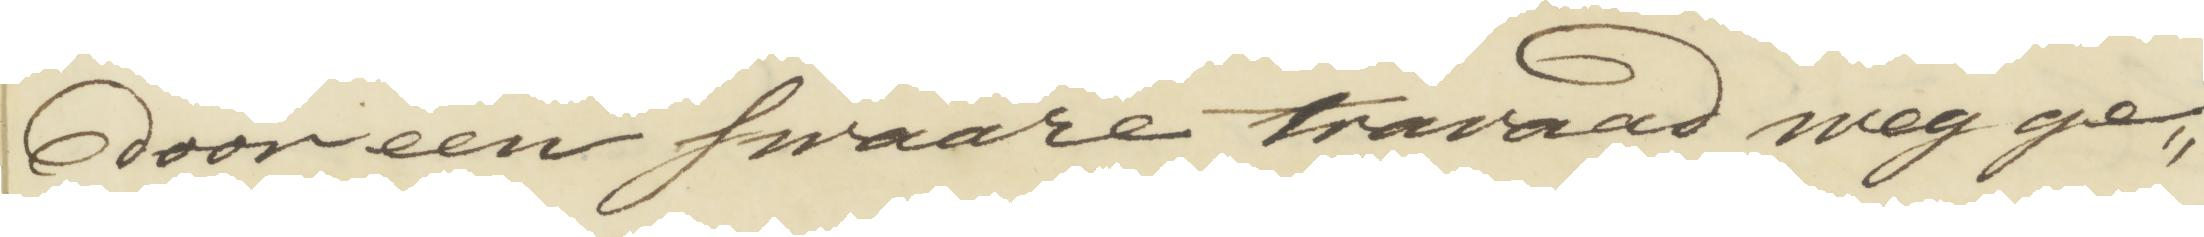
door een swaare travaad weg ge„
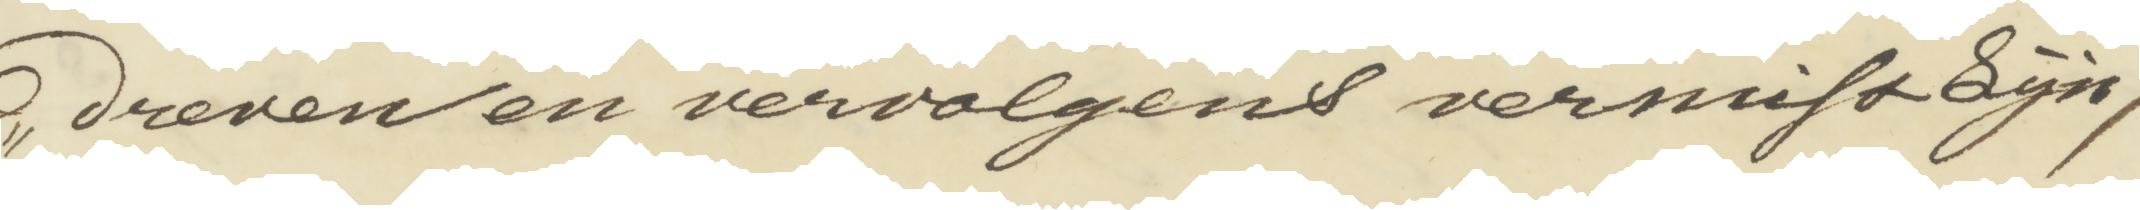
„dreven en vervolgens vermist Zijn,
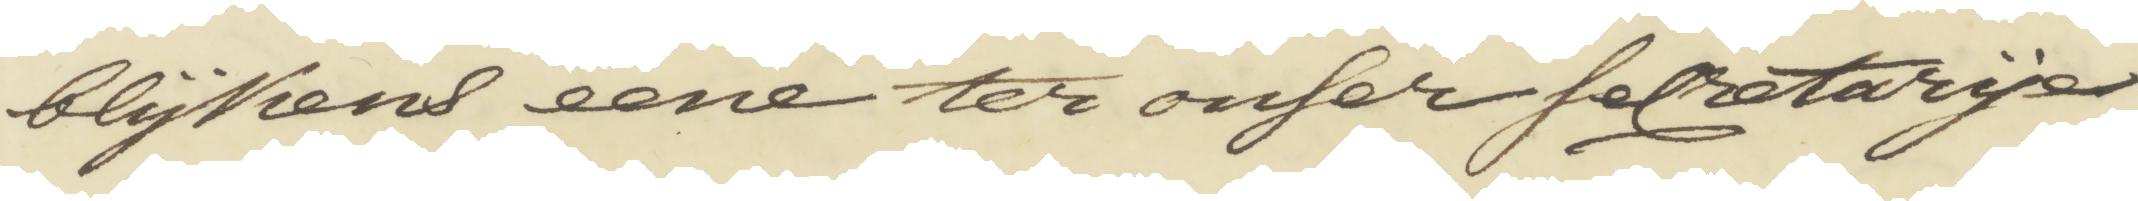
blijkens eene ter onser secretarije
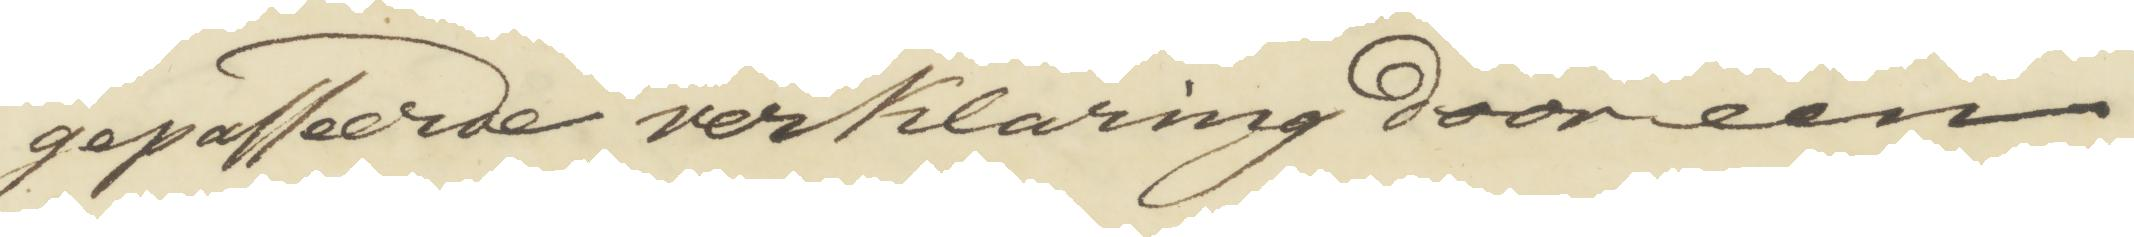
gepasseerde verklaring door een
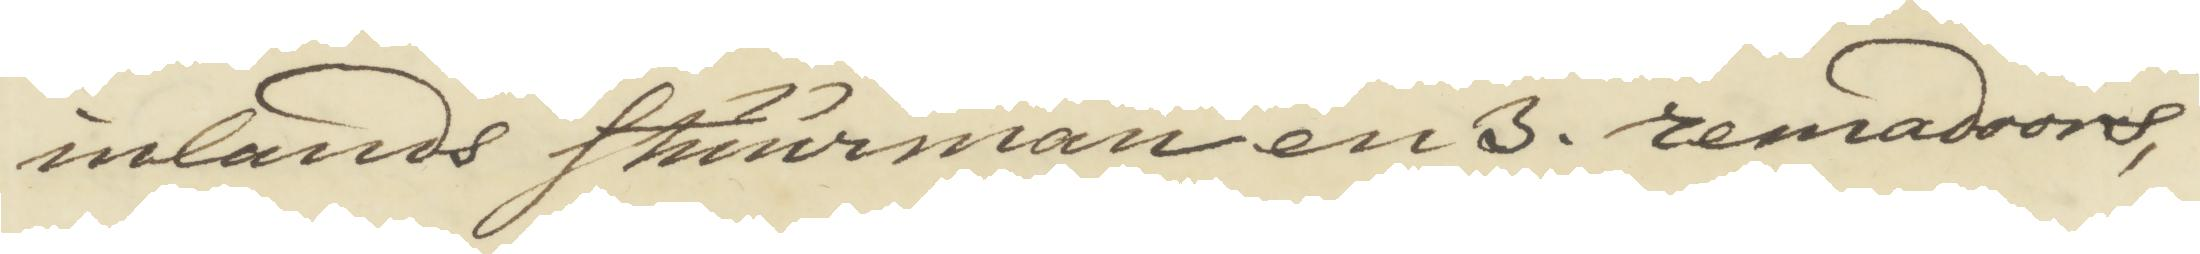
inlands stuurman en 3. remadoors,
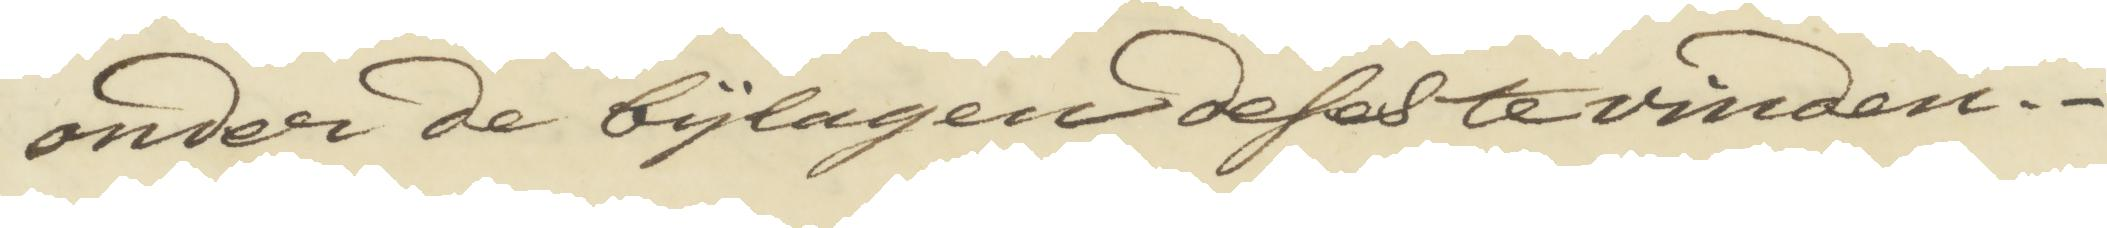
onder de bijlagen deses te vinden.-
